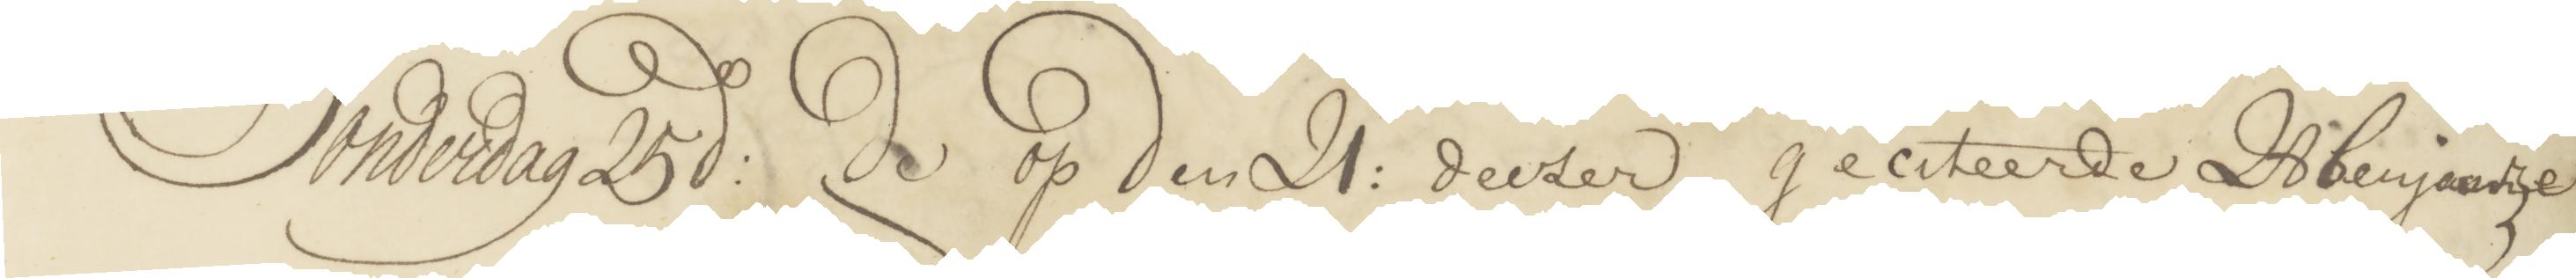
Donderdag 25:e de op den 21:' deezer, geciteerde 28 benjanze
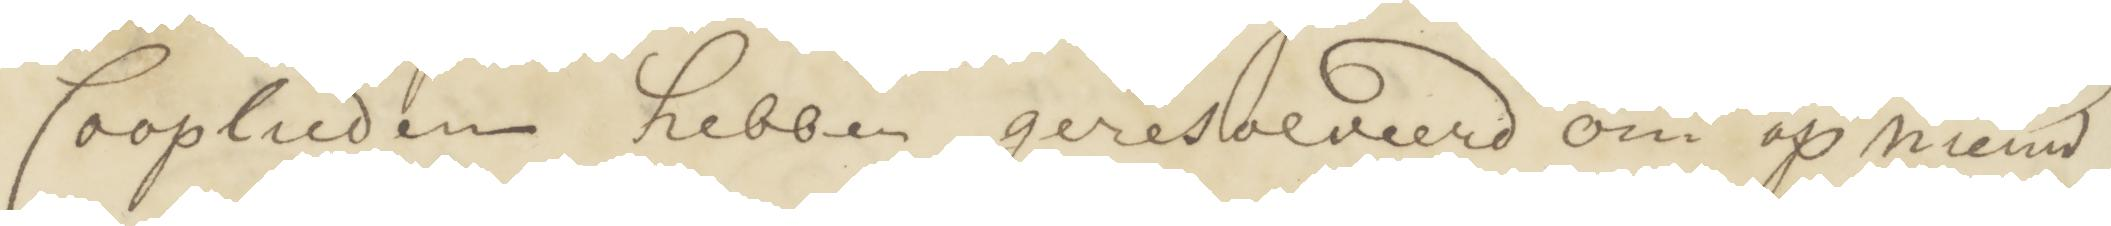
Cooplieden hebben geresolveerd om op nieuw
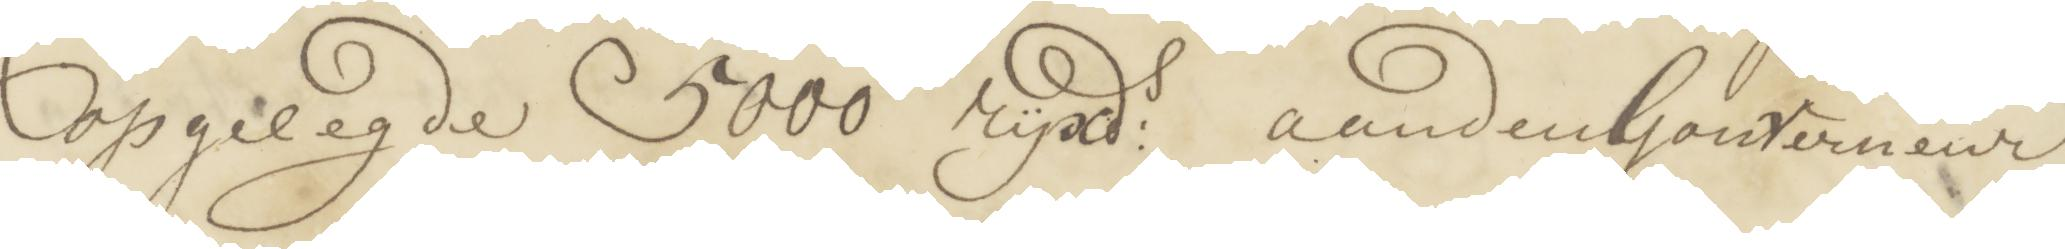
opgelegde 5000 rijxd:s aanden Gouverneur
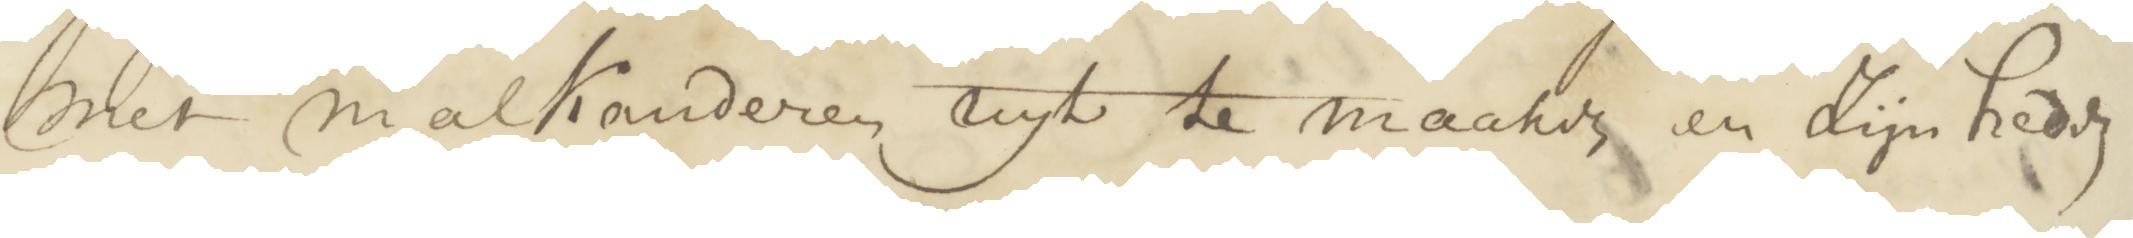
met malkanderen uyt te maaken en zijn heden
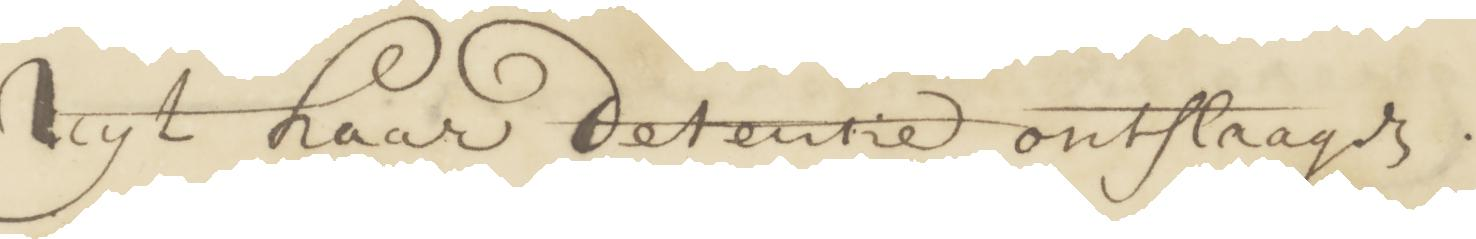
uyt haar detentie ontslaagen
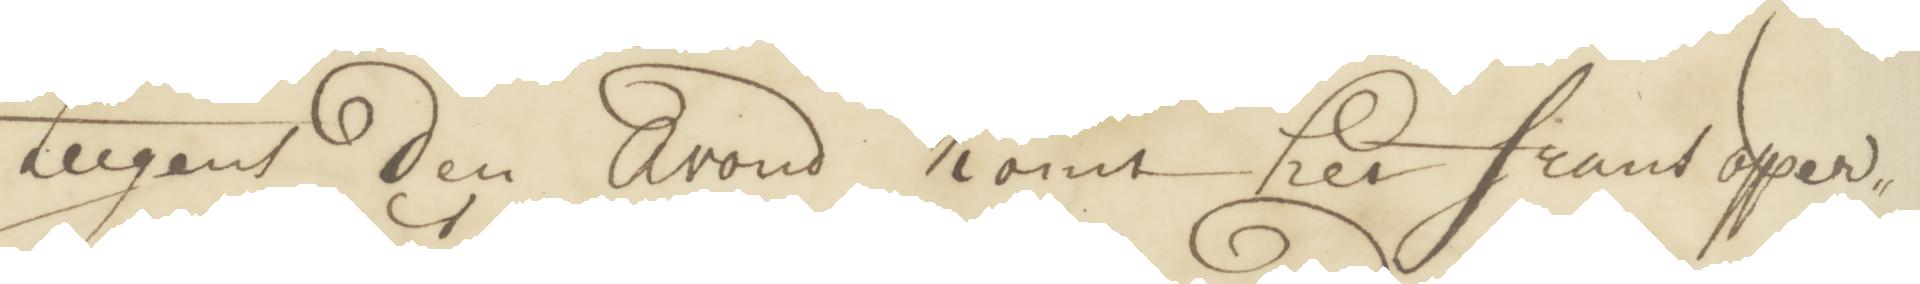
teegens den avond komt het frans opper„
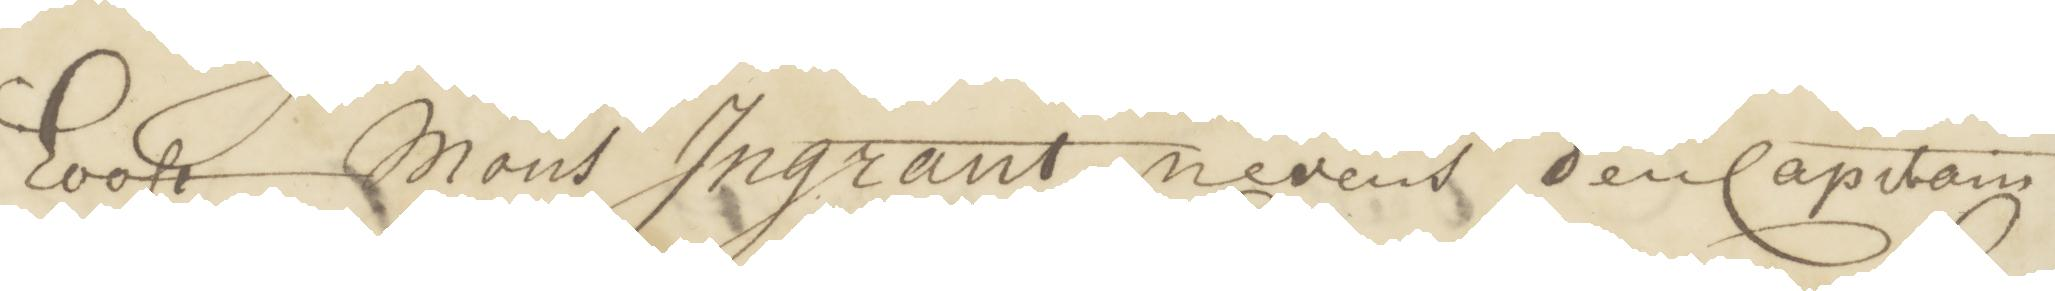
hooft Monsr Jngrant nevens den Capitain
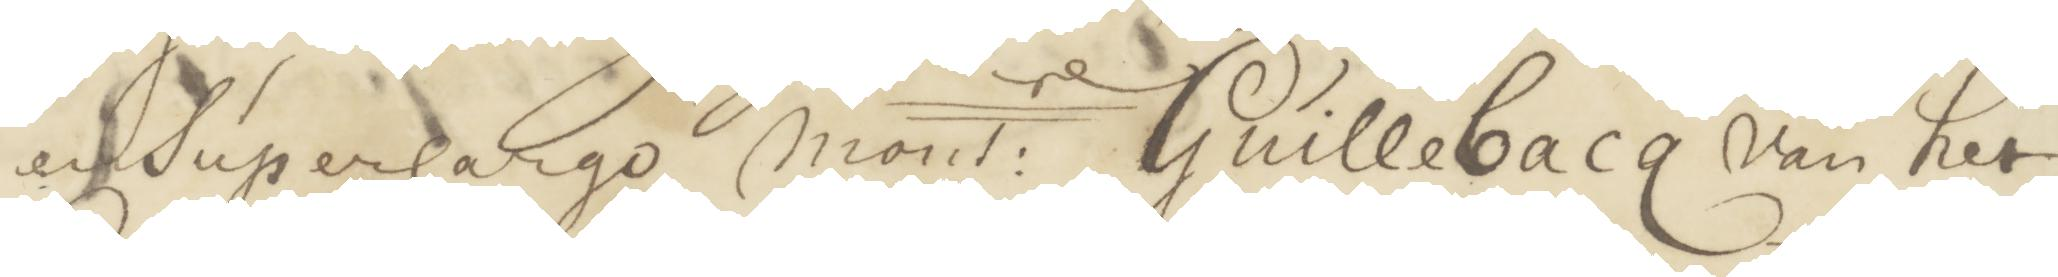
en supercargo mons:re Guillebacq van het
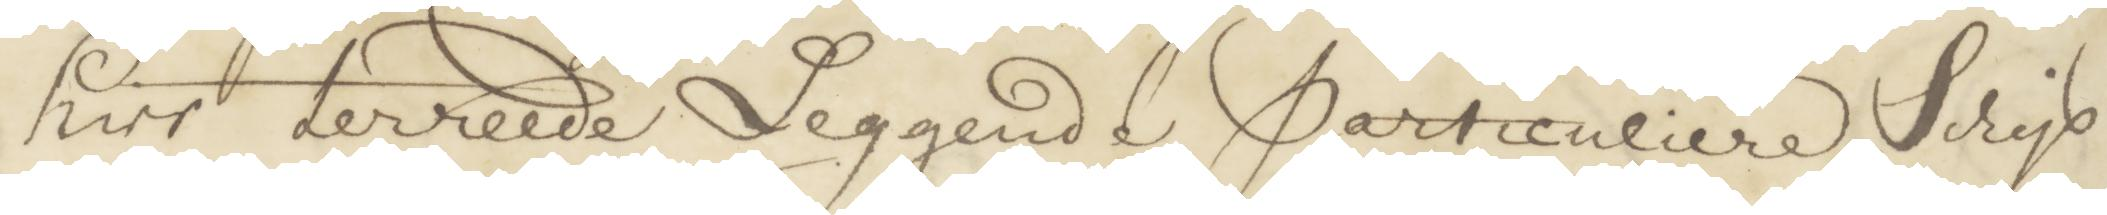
hier terreede Leggende Particuliere schip
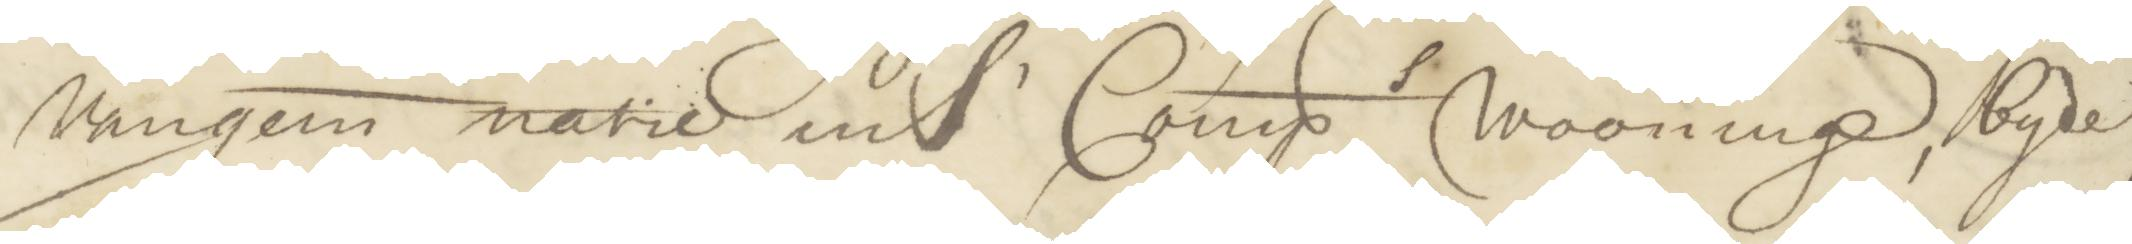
vangem natie in 's Comps wooninge, byde
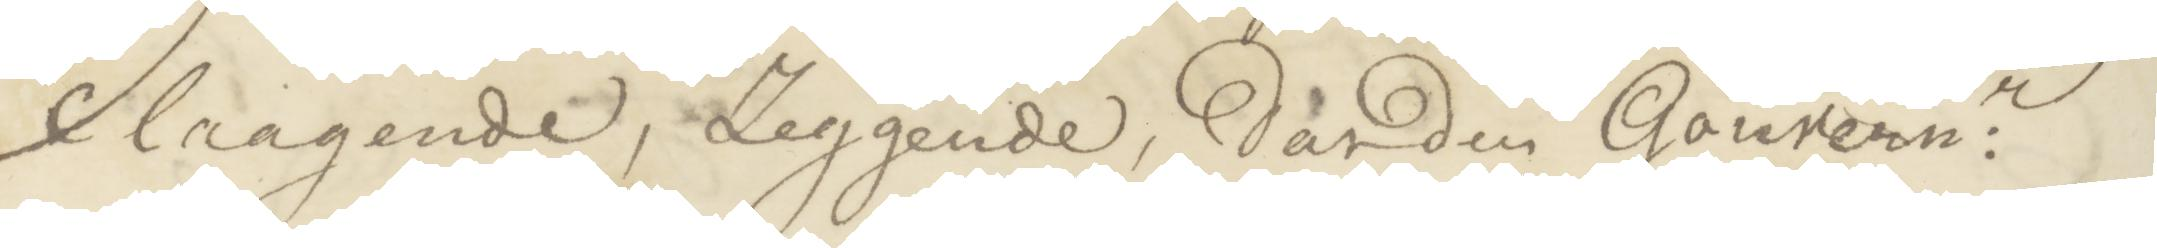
claagende, zeggende, dat den Gouvern:r
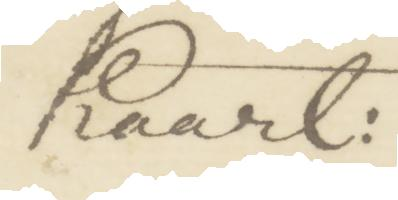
haarl:
